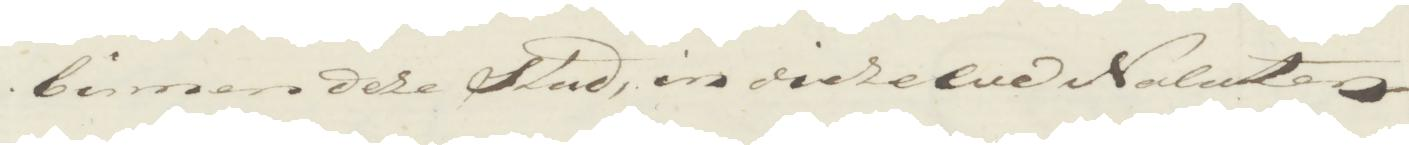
binnen deze Stad, in dezelve Nalaten
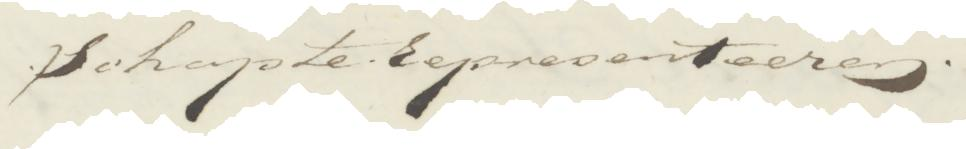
schap te representeeren.
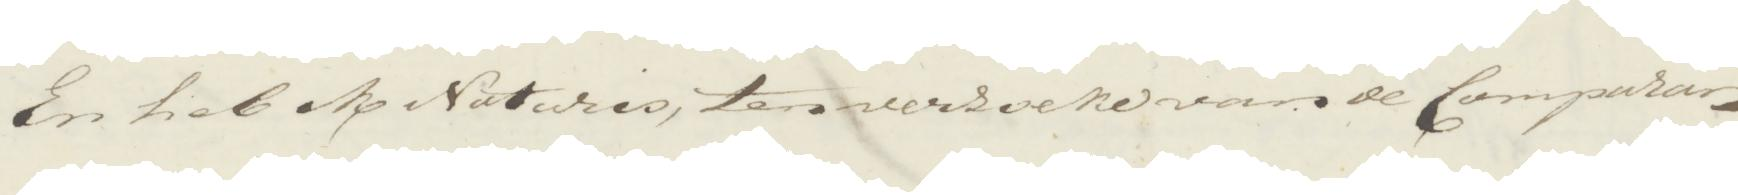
En heb ik Notaris, ten verzoeke van de Comparan
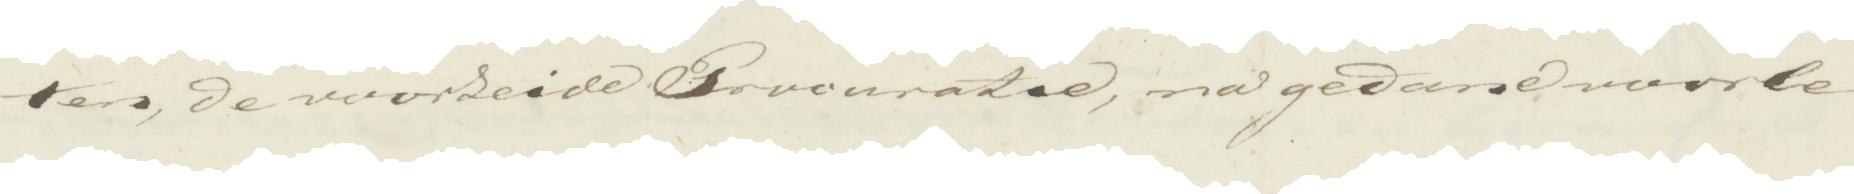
ten, de voorzeide Procuratie, na gedane voorle
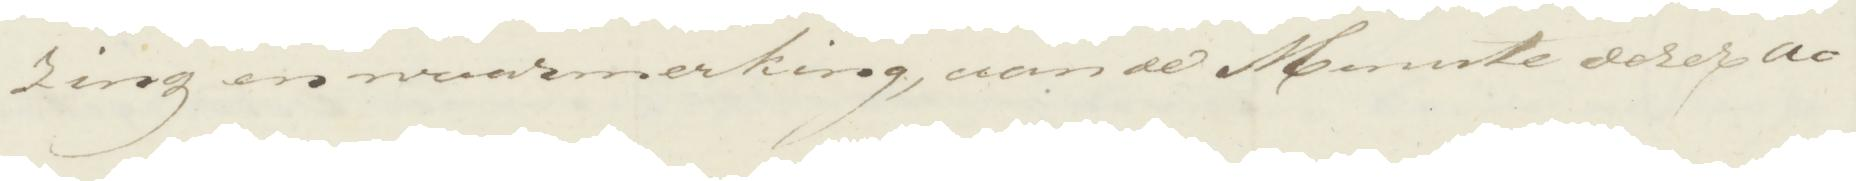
zing en waarmerking, aan de Minute dezer ac
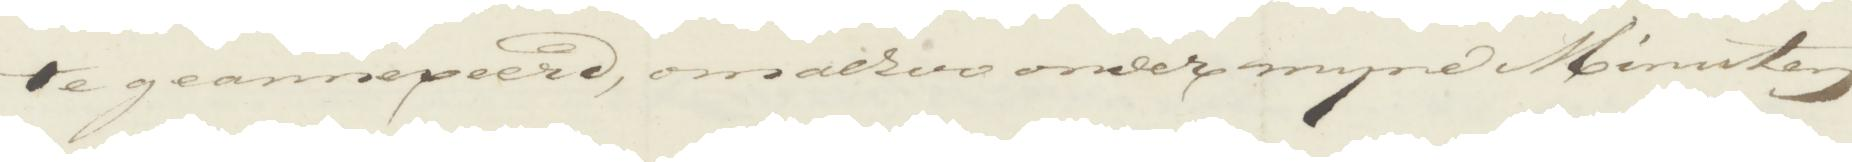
te geannexeerd, om alzoo onder myne Minuten
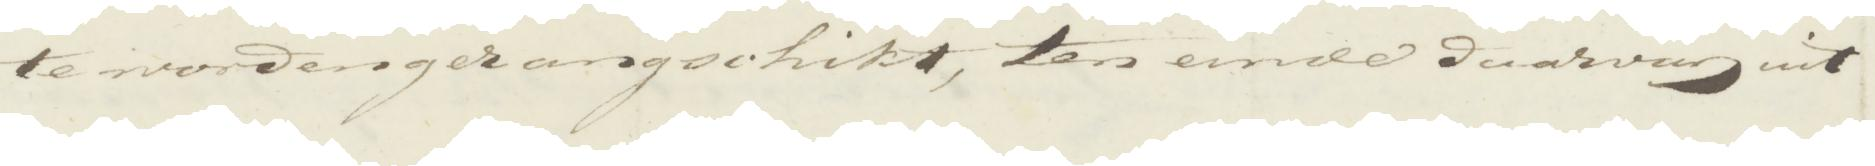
te worden gerangschikt, ten einde daarvan uit
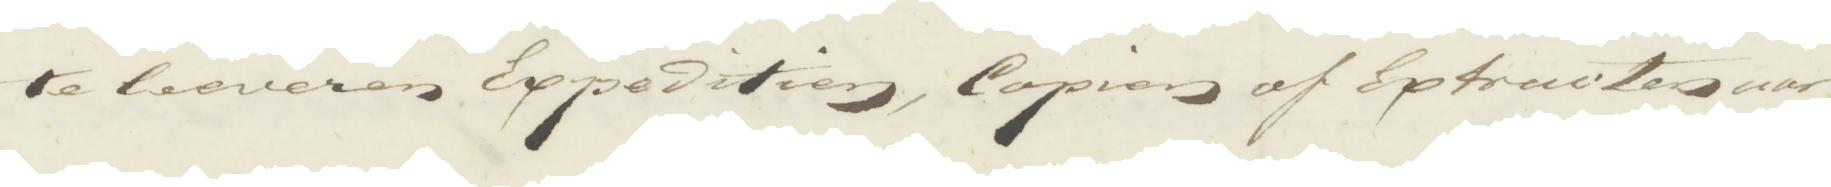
te leeveren Expeditien, Copien of Extracten van
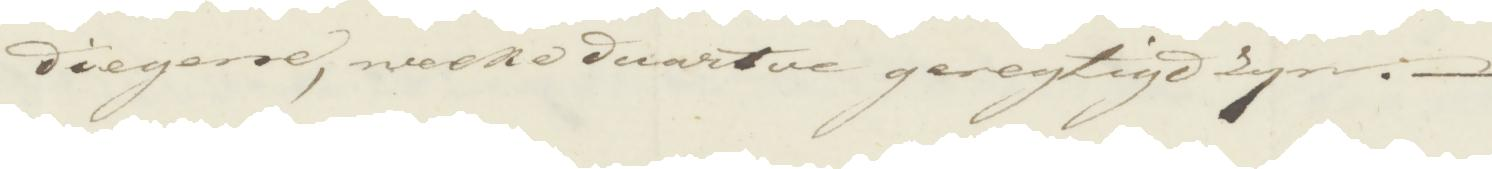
diegene, welke daartoe geregtigd zyn.
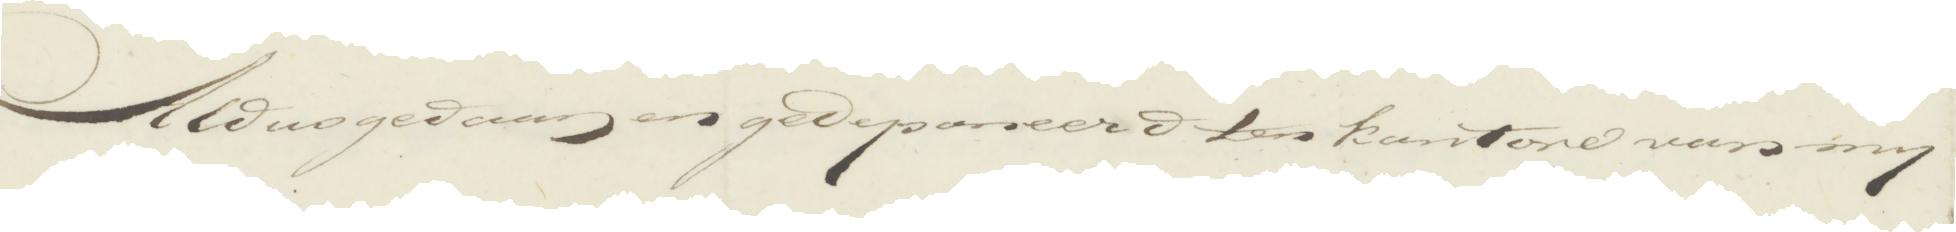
Aldus gedaan en gedeponeerd ten kantore van my
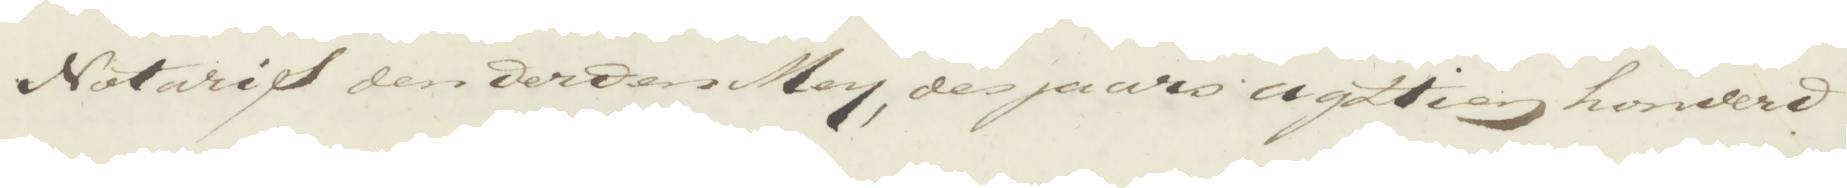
Notaris den derden Mey, des jaars agttien honderd
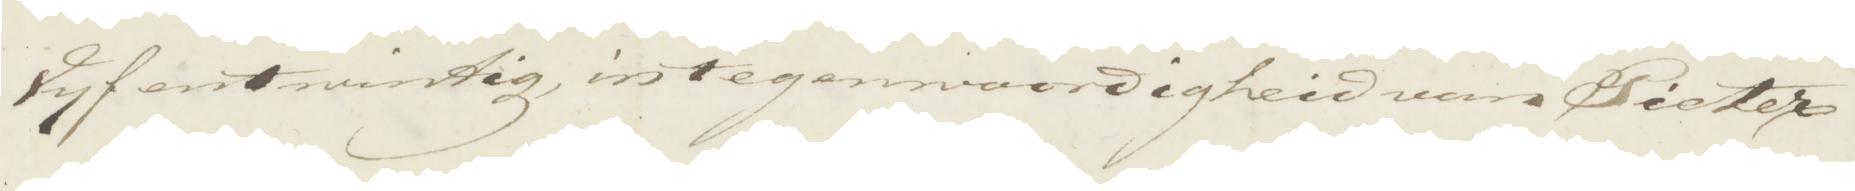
Vyf entwintig, in tegenwoordigheid van Pieter
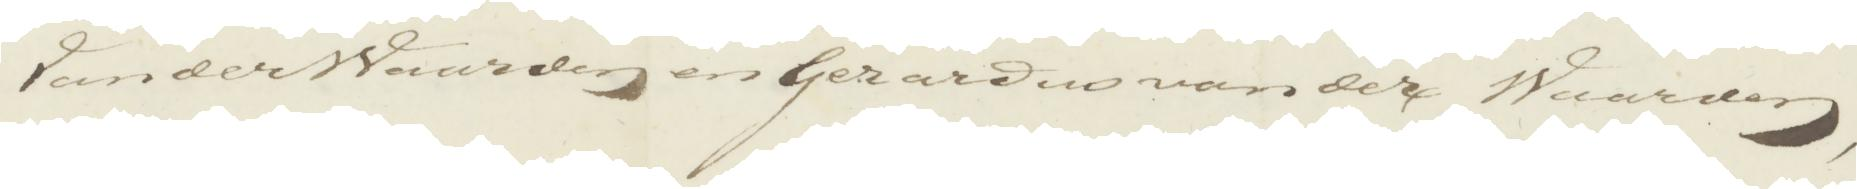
Van der Waarden en Gerardus van der Waarden,
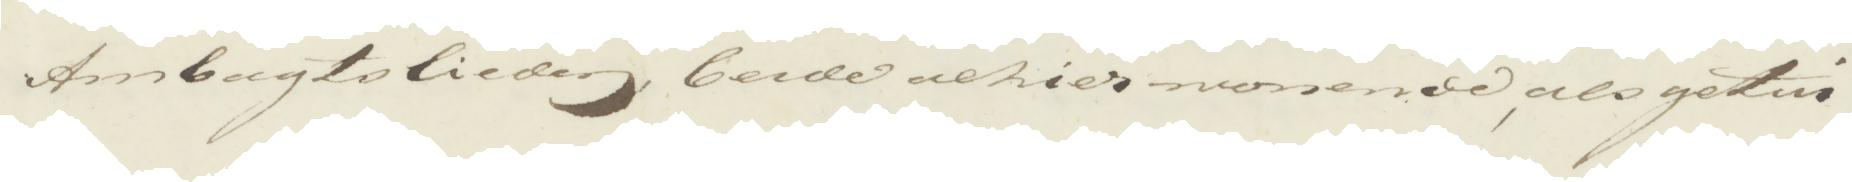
Ambagtslieden, beide alhier wonende, als getui
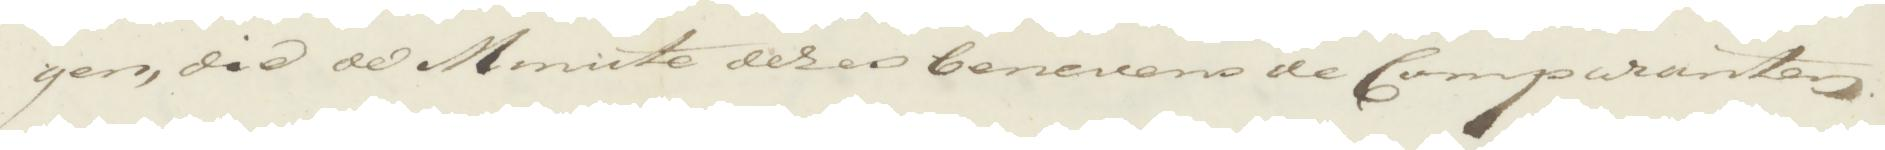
gen, die de Minute dezes benevens de Comparanten
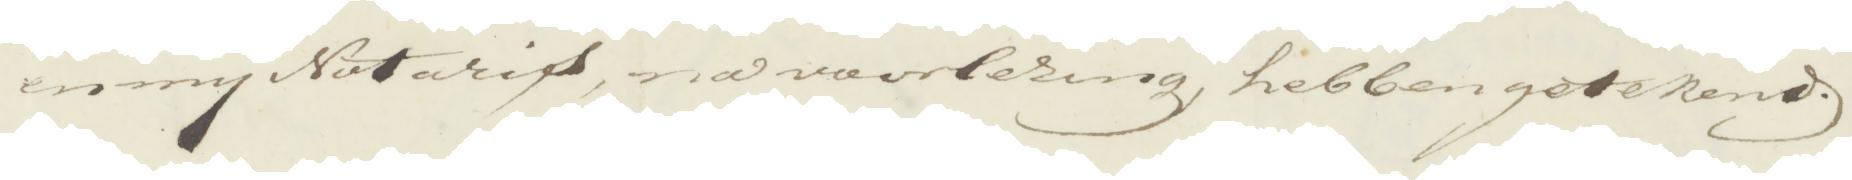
en my Notaris, na voorlezing, hebben getekend.
